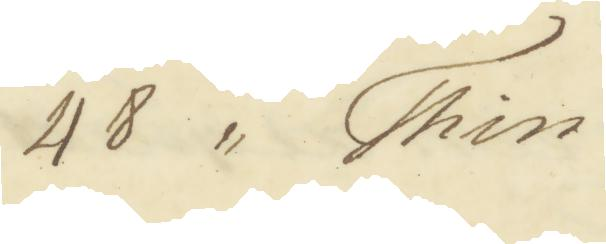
48 „ Thin
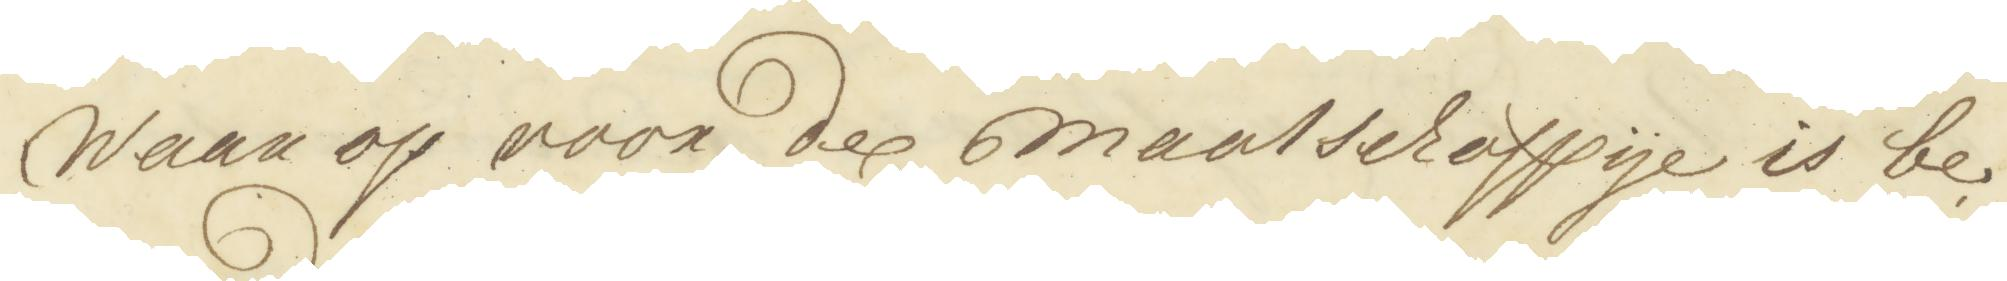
waar op voor de maatschappije is be„
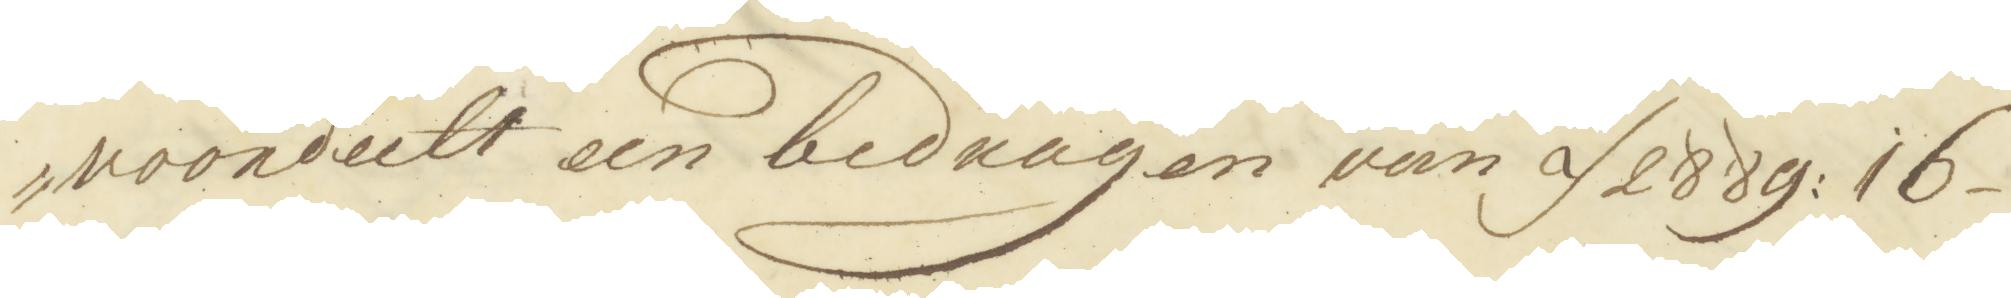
„voordeelt een bedragen van ƒ2889: 16 —
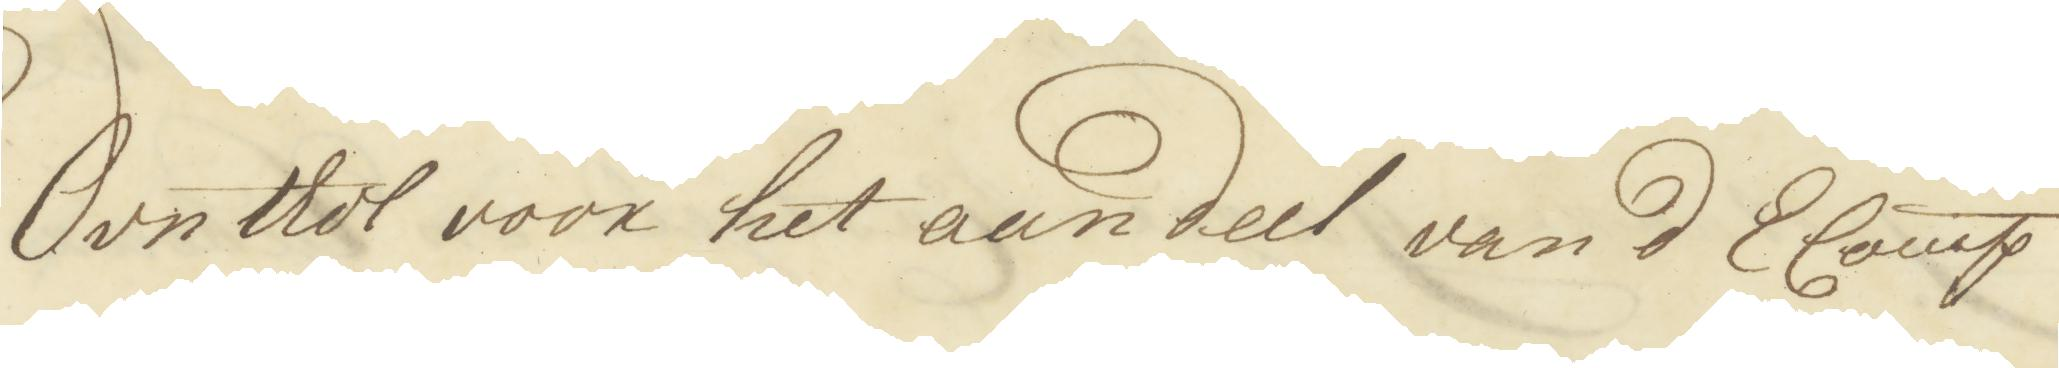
Den thol voor het aandeel van d EComp
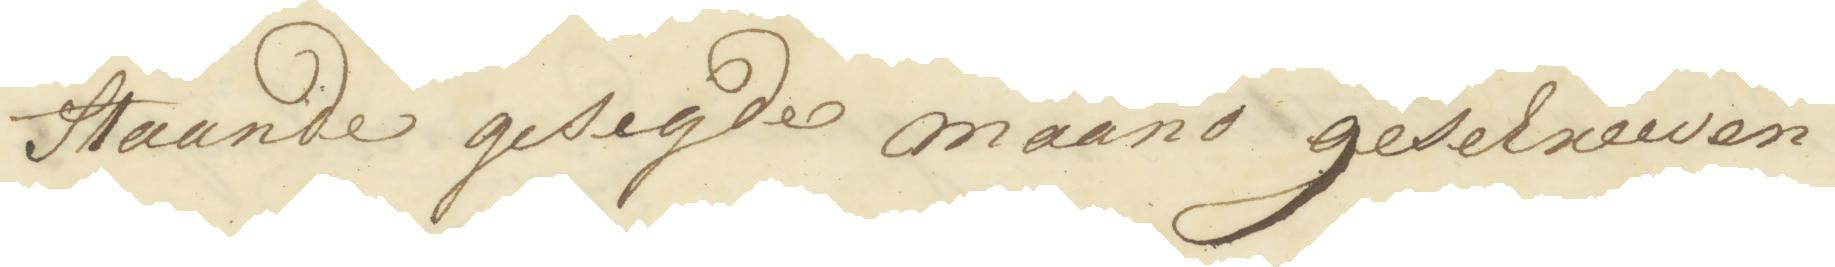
staande gesegde maand geschreeven
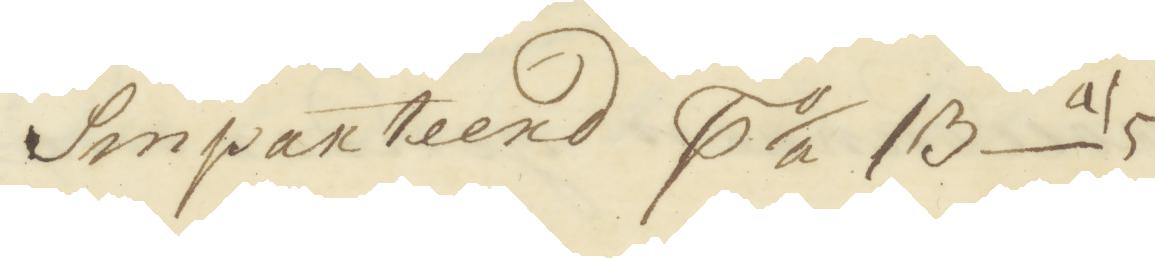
Importeerd po/a 13—4/5
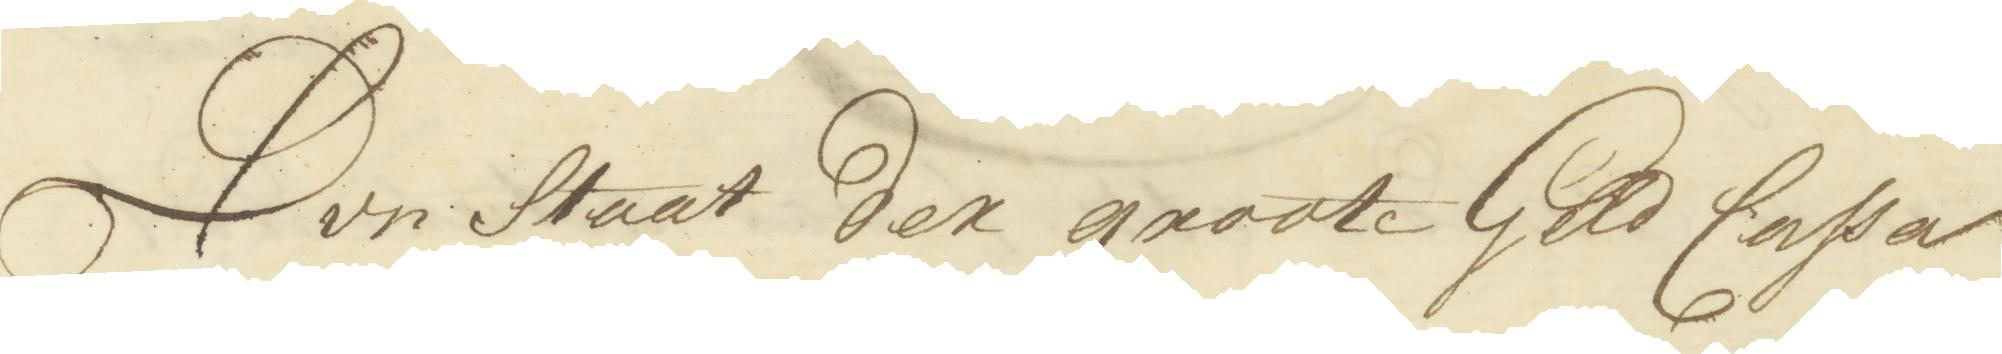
Den staat der groote Geld Cassa
